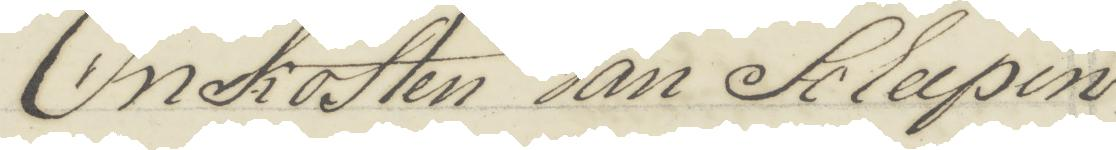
Onkosten van Scheepen
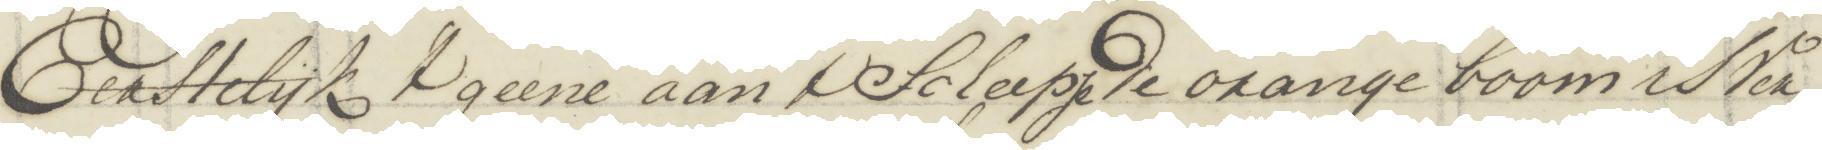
Eerstelijk ’t geene aan t scheepje de orange boom is ver
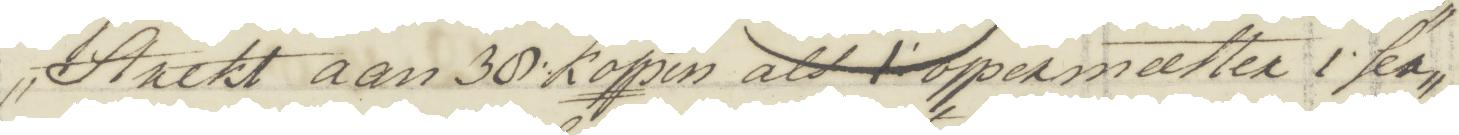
„strekt aan 38: koppen als t' oppermeester 1 ser„
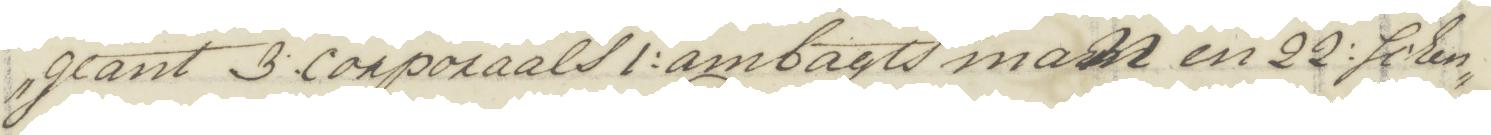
„geant 3 Corporaals 1: ambagts man en 22: schen„
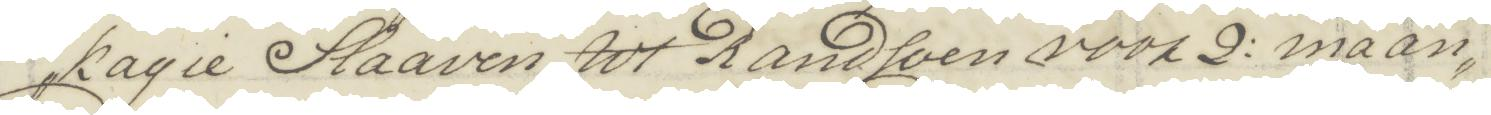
„kagie Slaaven tot Randsoen voor 2: maan„
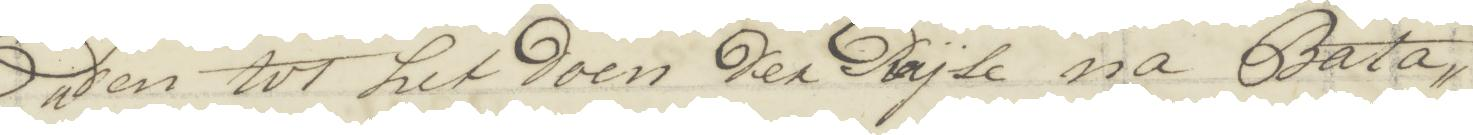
den tot het doen der Rijse na Bata„
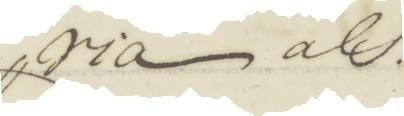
„via als.
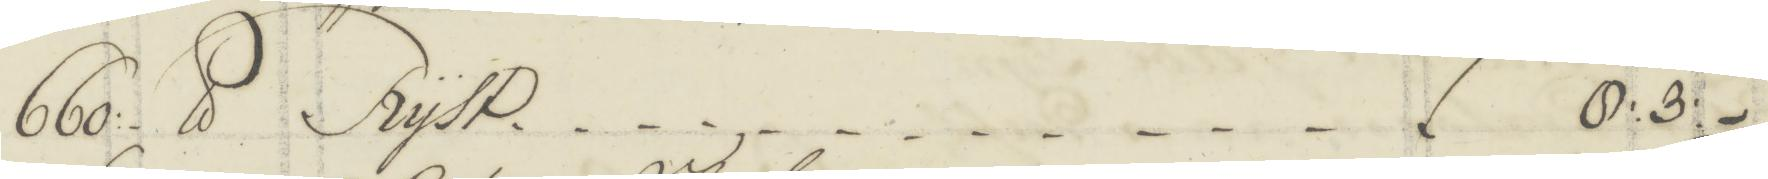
660: lb Rijst - - - - - - - - - - - - ƒ 8:3:—
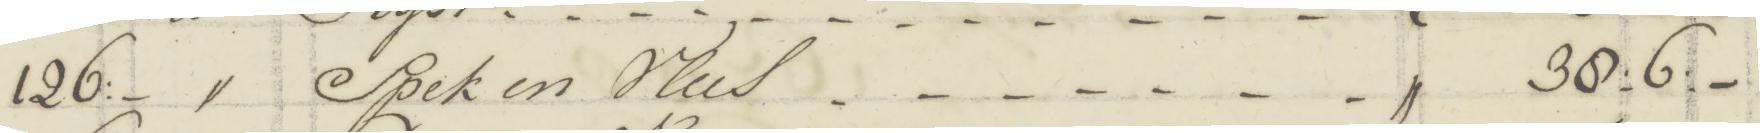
126:—„ Spek en Vlees - - - - - - - „ 38:6:—
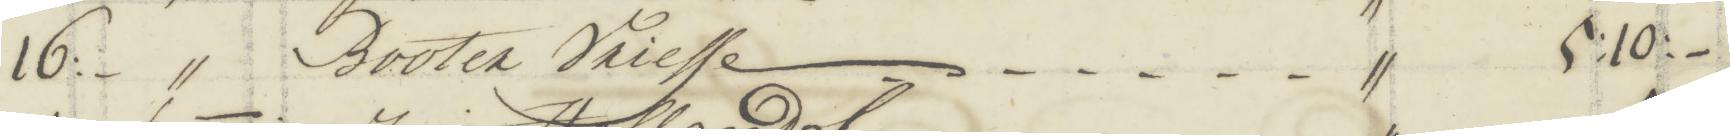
16:— „ Booter Vriesse - - - - - „ 5:10:—
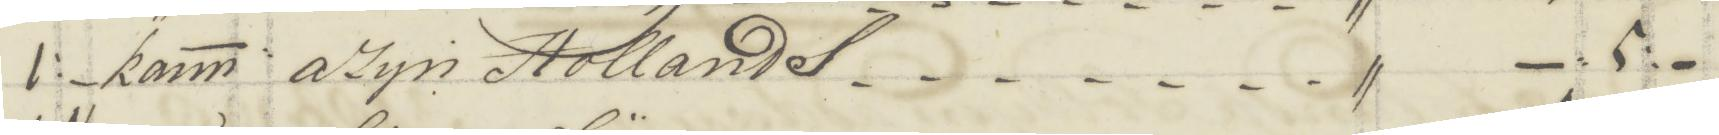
1:— kann azijn Hollands - - - - - - - „ —: 5:—
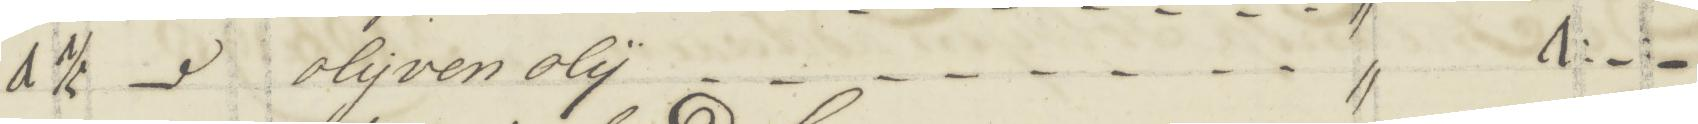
4½ _o olijven olij - - - - - - - - „ 4:—:—
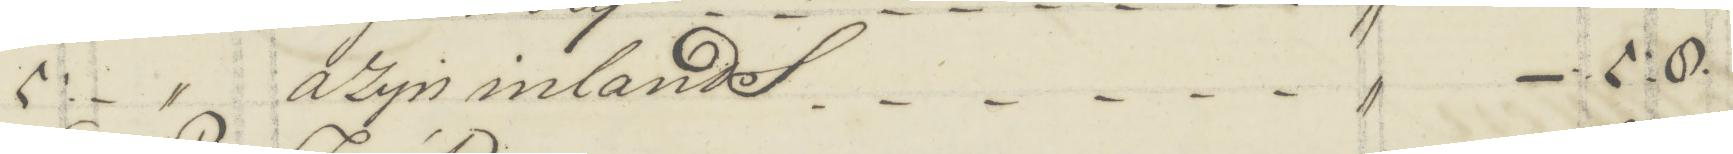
5:— „ azijn inlands - - - - - - „ —:5:8.
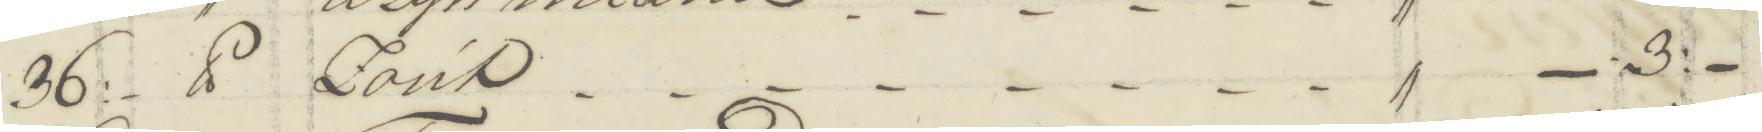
36: lb Zout - - - - - - - - „ —:3:—
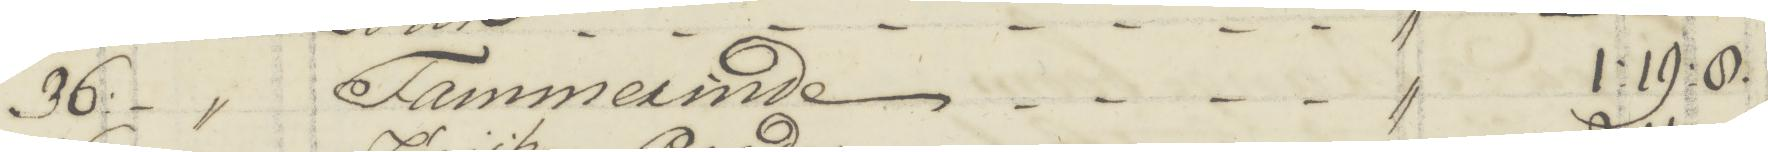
36:— „ Tammerinde - - - - „1:19:8.
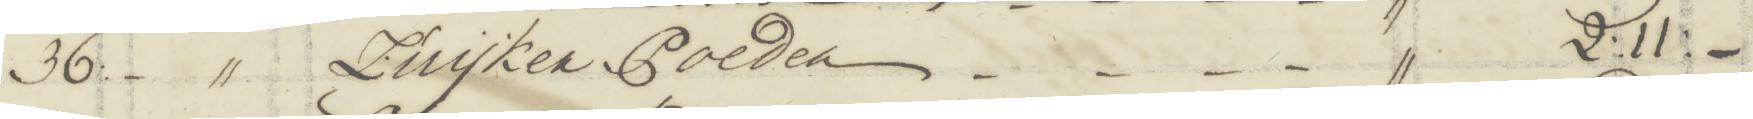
36:— „ Zuijker Poeder - - - - „ 2:11:—
